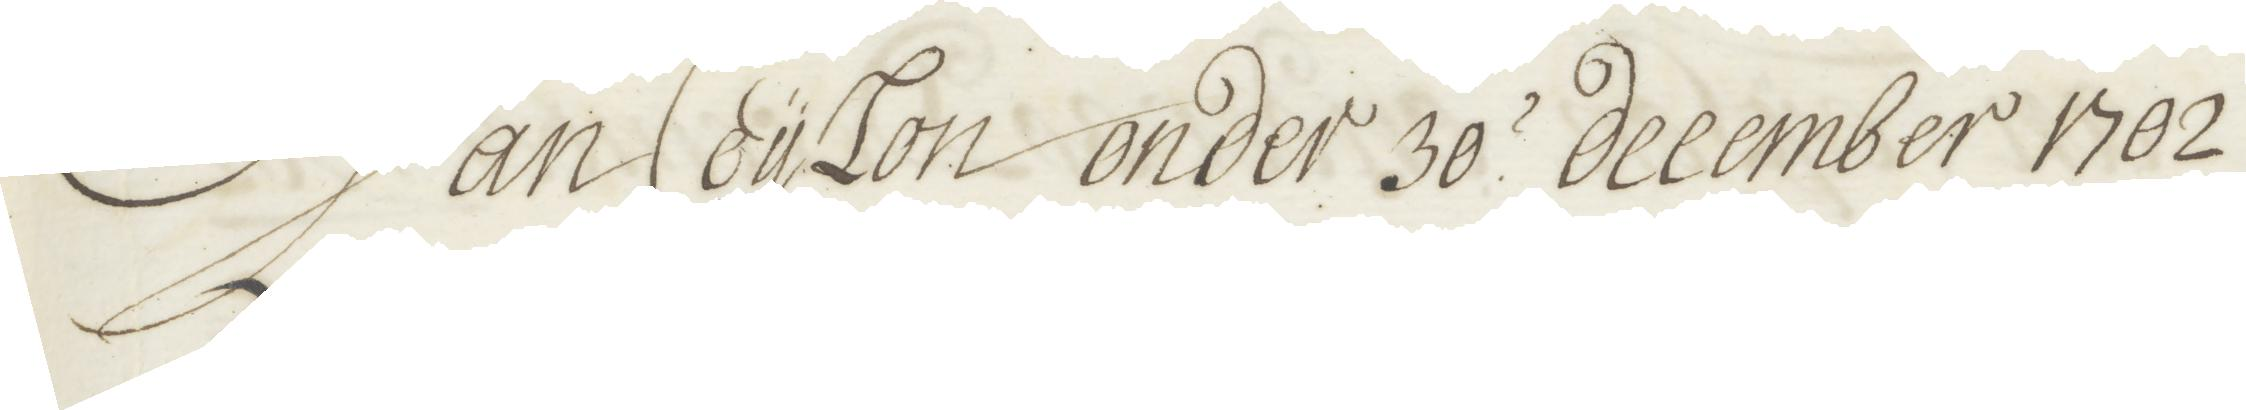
Van Ceijlon onder 30:' december 1702
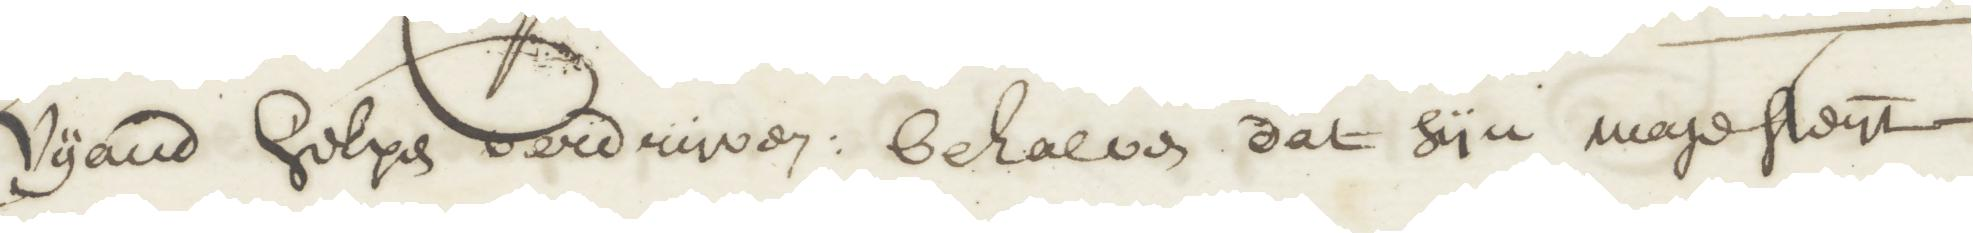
vijand helpen verdrijven: behalven dat sijn magesteyt—
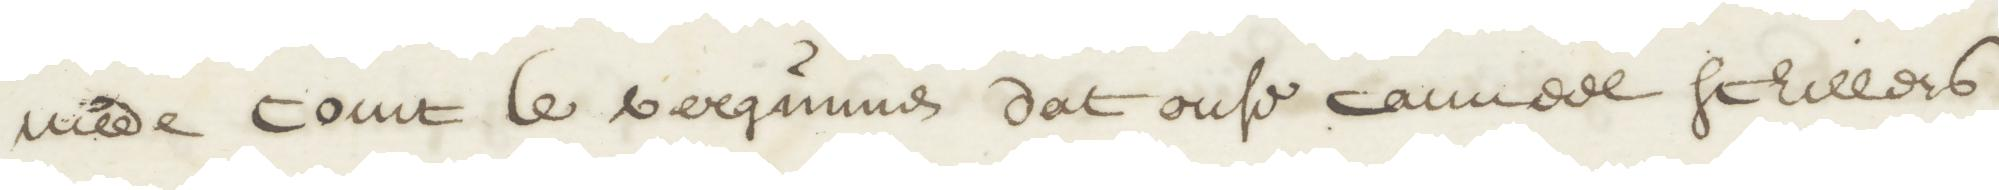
mede comt te vergunnen dat onse canneel schillers
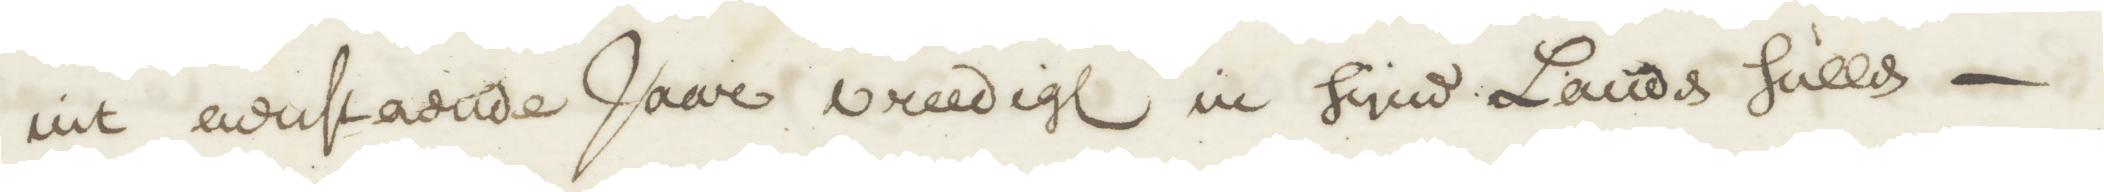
int aenstaende Jaar vreedigh in sijne Landen sullen —
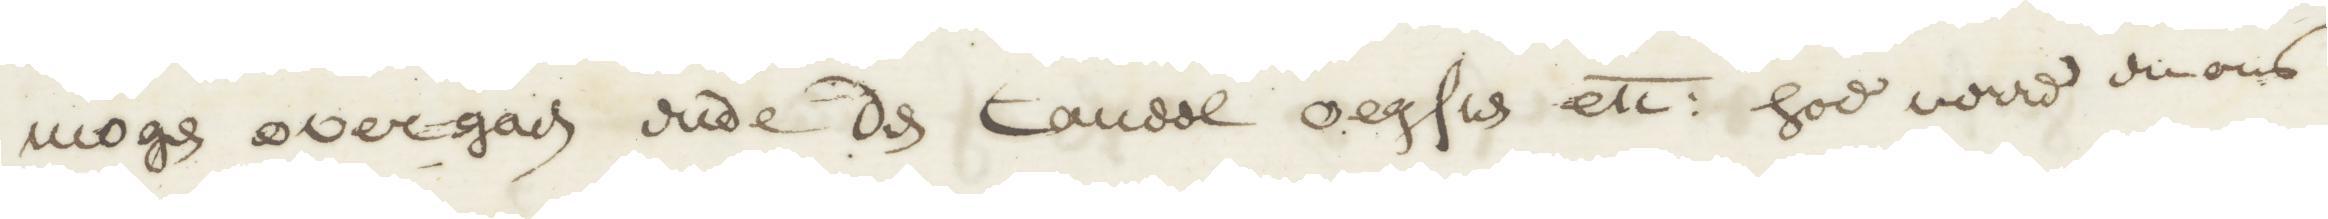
mogen overgaen ende den caneel oegsten etc: hoe verre en ons
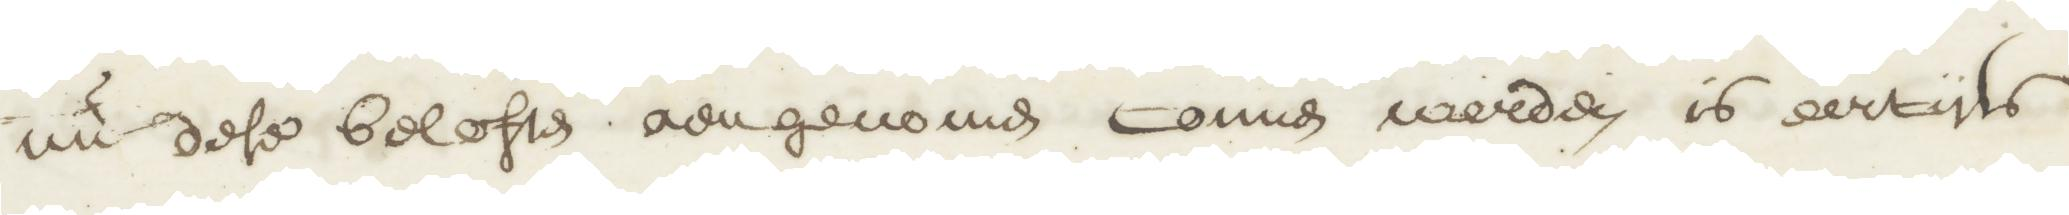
nu dese beloften aengenomen connen werden is eertijts
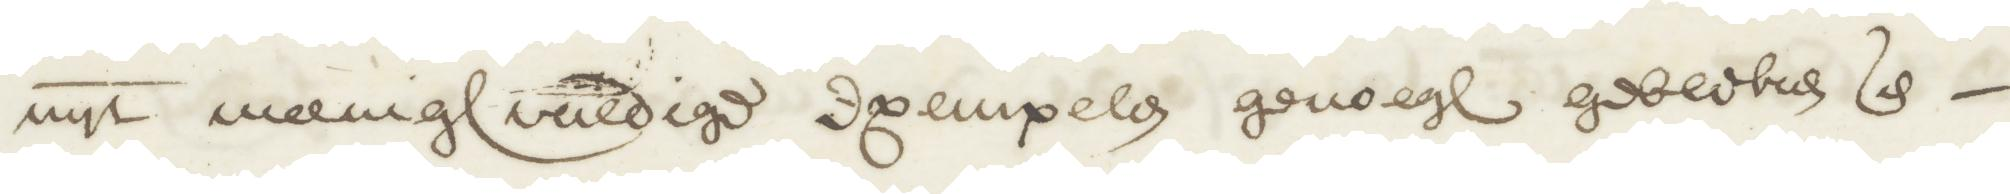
uijt meenigh vredige exempelen genoegh gebleken en —
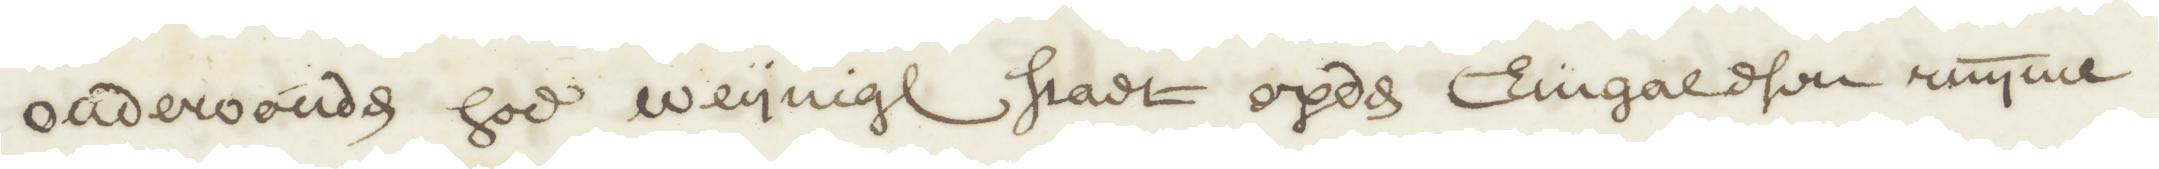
ondervonden hoe weijnigh staet op den Chingalesen ruijme
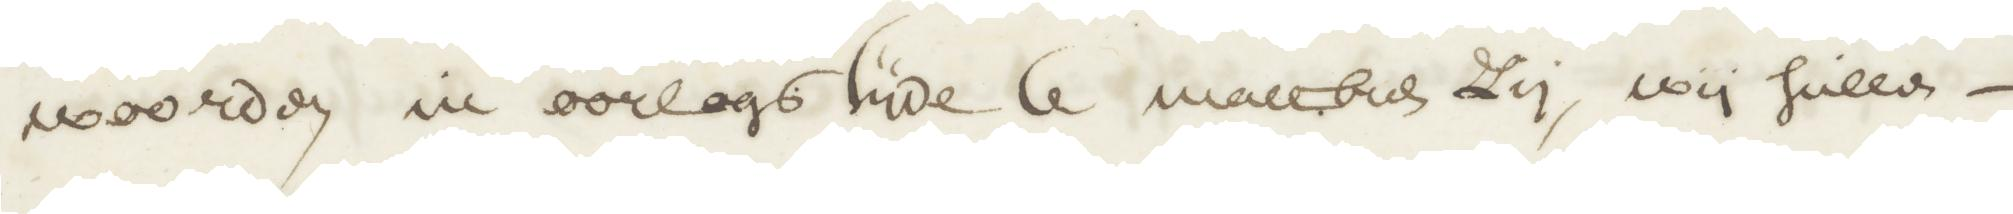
woorden in oorlogs tijde te maecken zij, wij sullen —
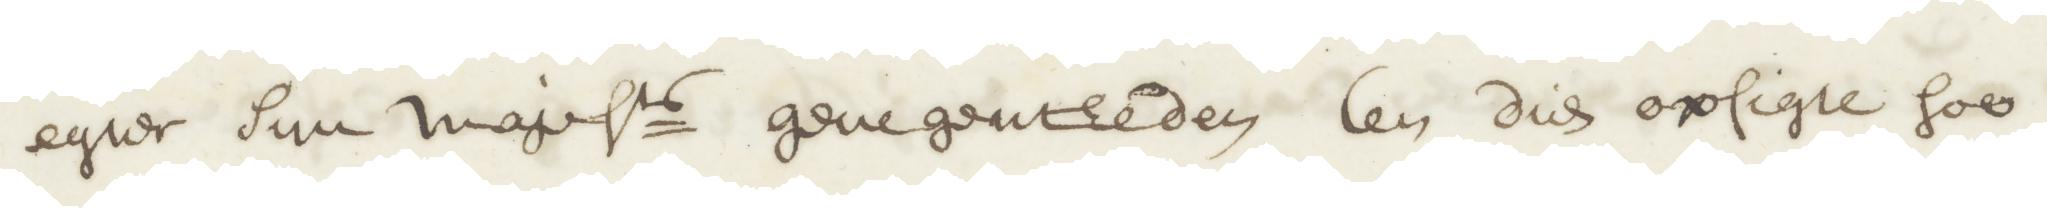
egter sijn majest=s genegentheden ten dien opsigte soo
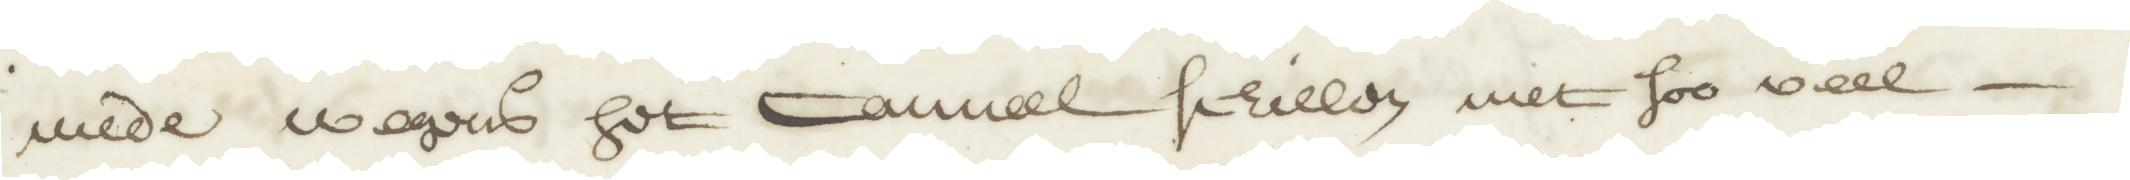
mede wegens het canneel schillen met soo veel —
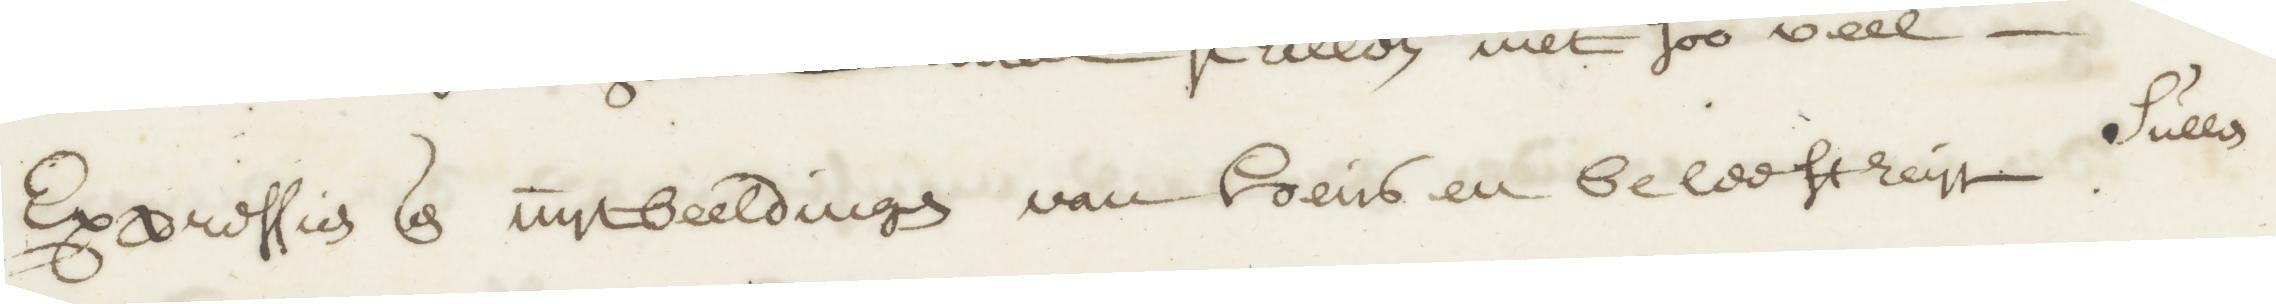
Expressien en uijtbeeldingen van heus en beleeftheijt sullen
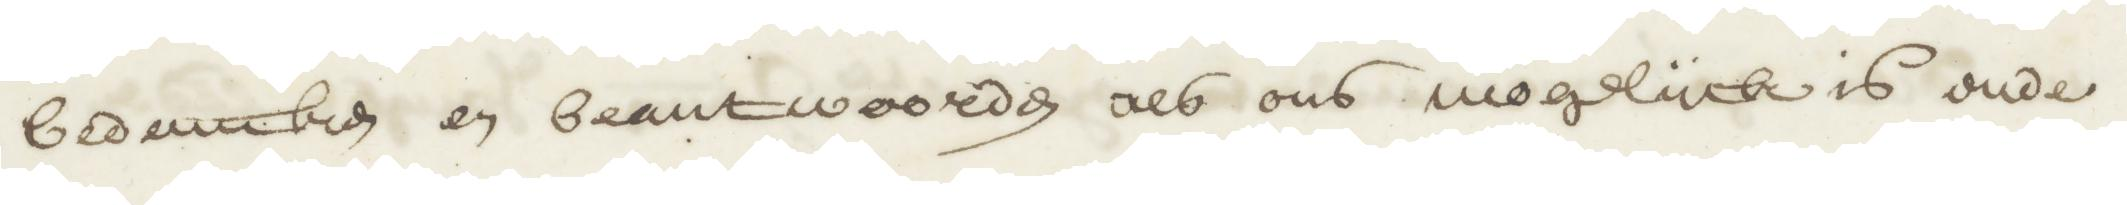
bedancken en beantwoorden als ons mogelijck is ende
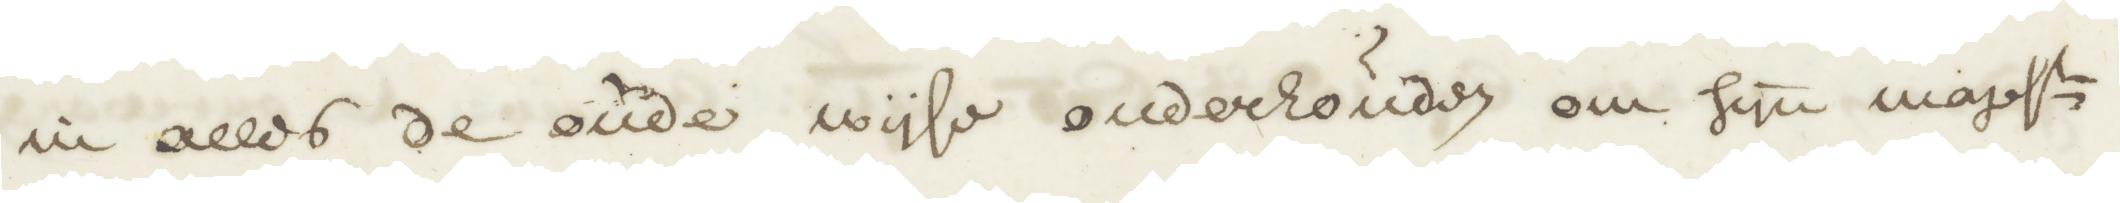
in alles de oude wijse onderhouden om sijn majes=t
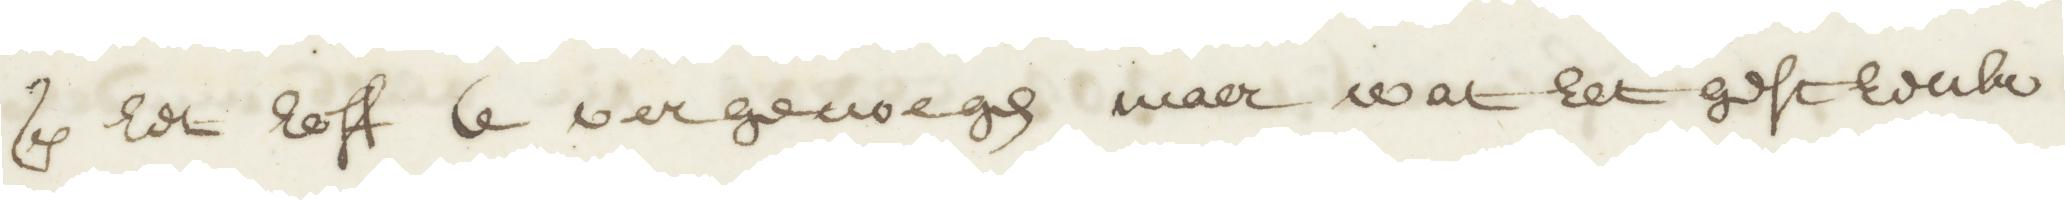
en het hoff te vergenoegen maer wat het geschenck
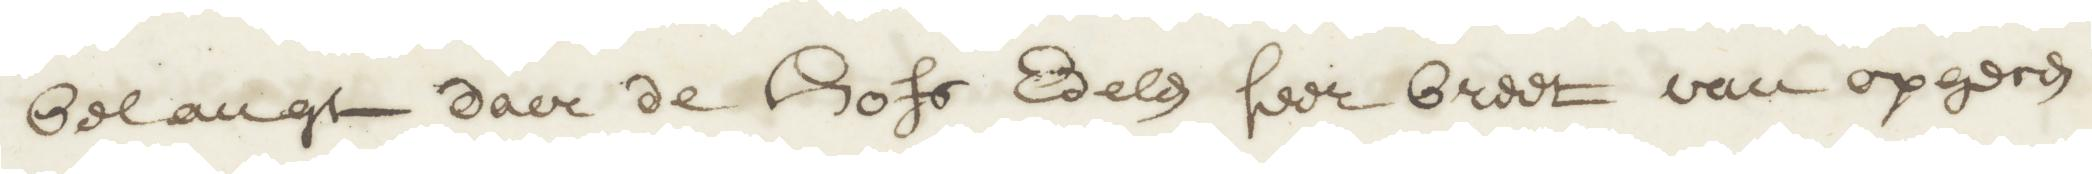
belangt daer de Hofs Edelen seer breet van opgeven
